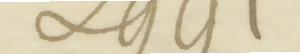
2991
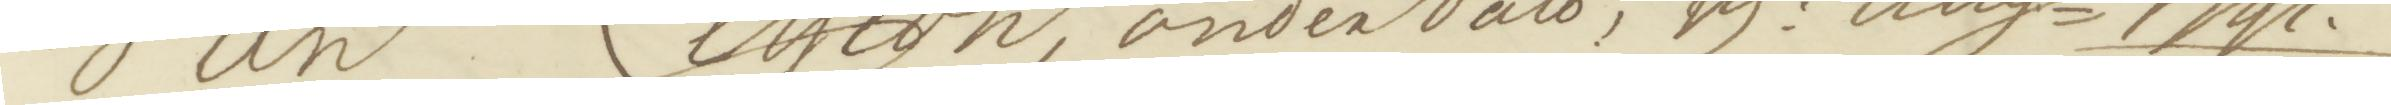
Van Ceijlon, onder dato, 19:' aug=s 1741.
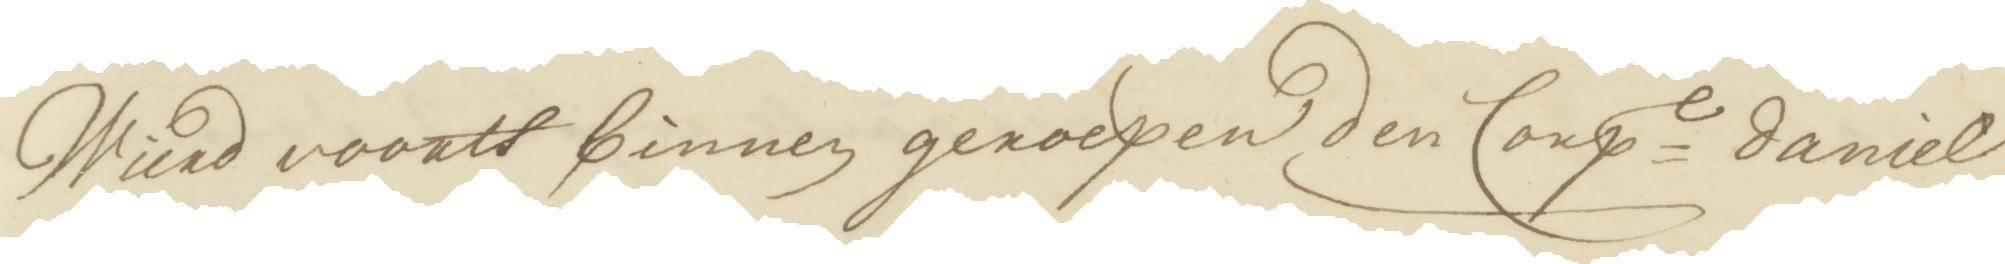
Wierd voorts binnen geroepen den Corp=l daniel
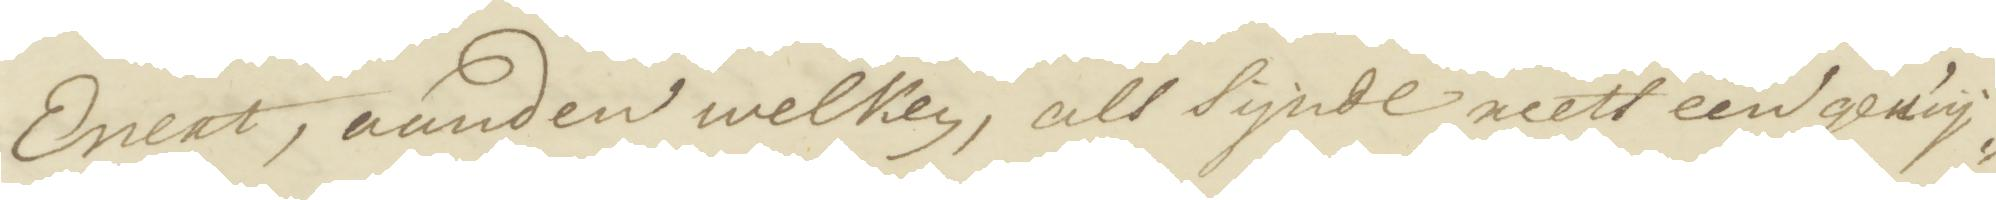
Enert, aanden welken, als sijnde reets een geruij„
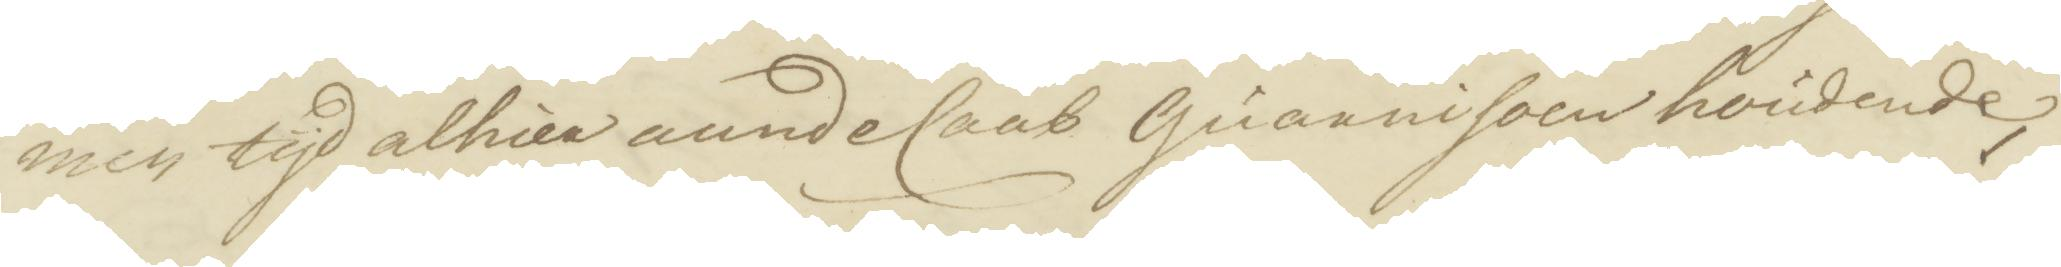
men tijd alhier aande Caab guarnisoen houdende,
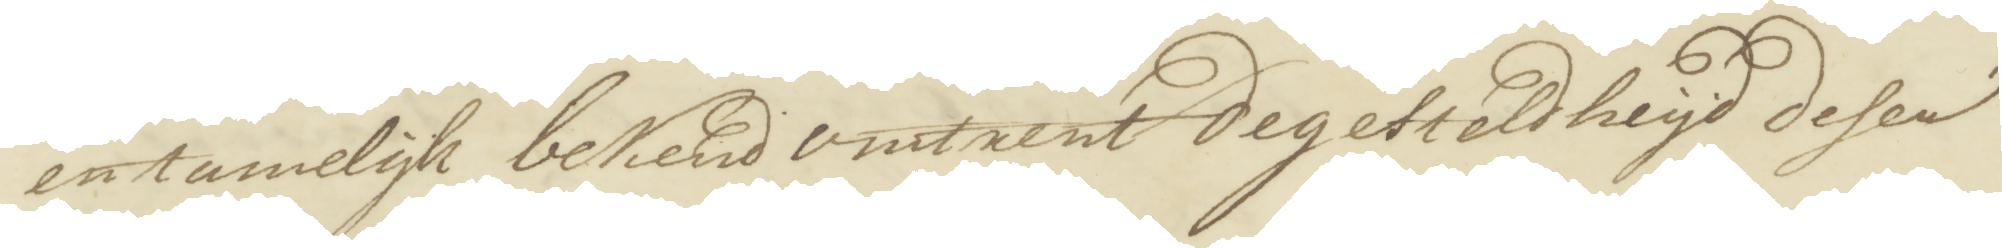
en tamelijk bekend omtrent de gesteldheijd desen
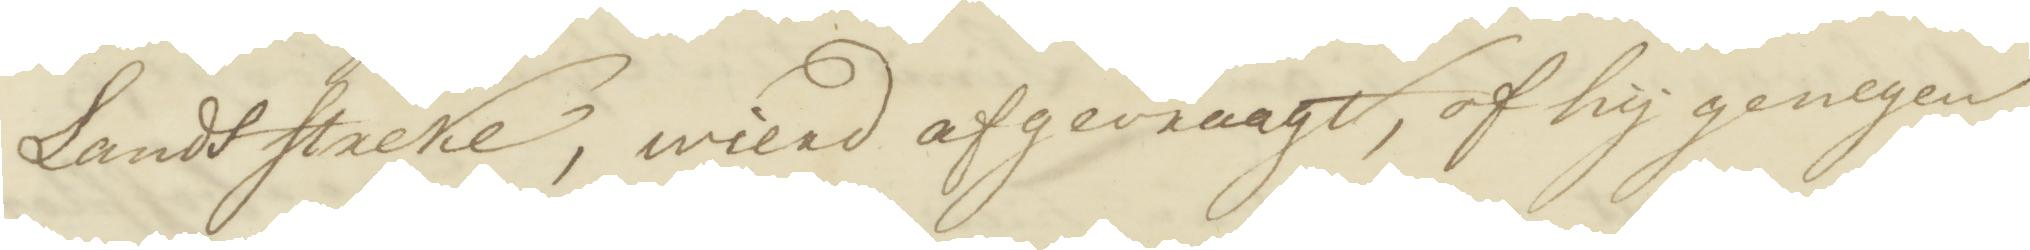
Lands streke, wierd afgevraagt, of hij genegen
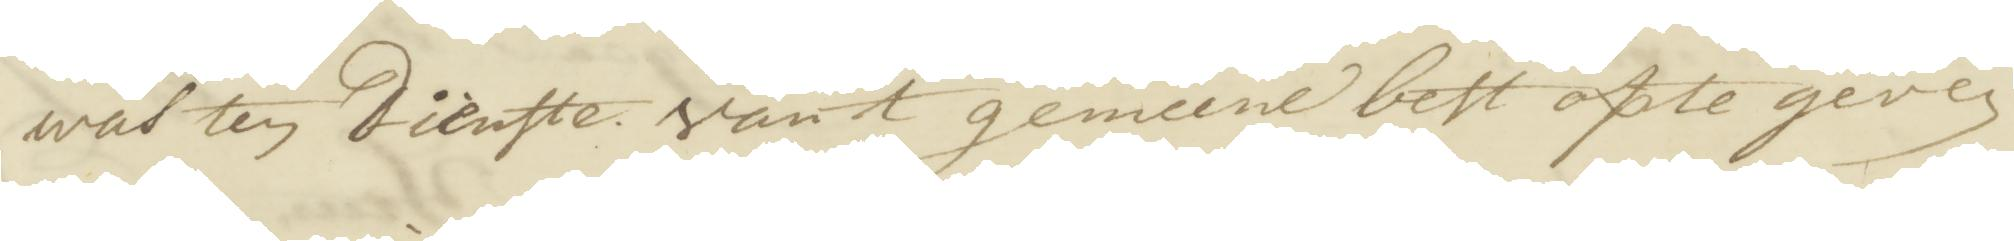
was ten dienste. van ’t gemeene best op te geven
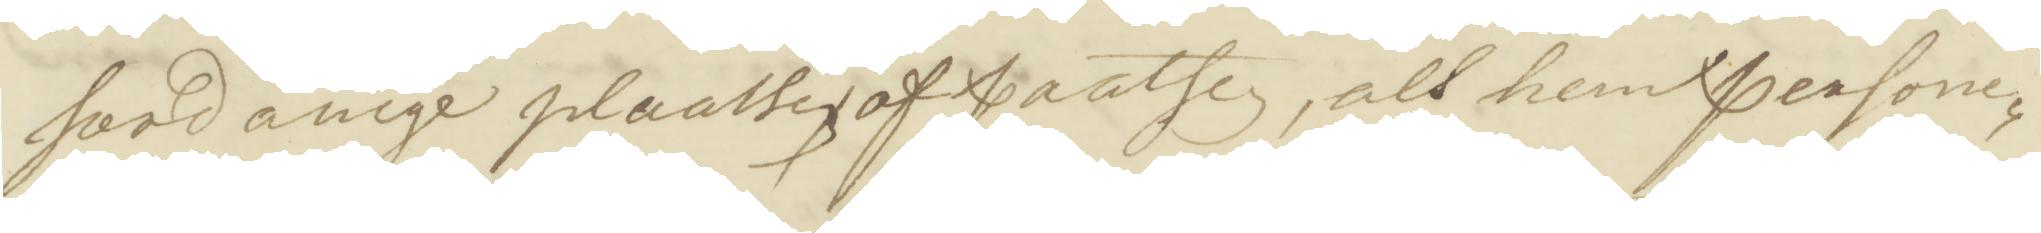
soodanige plaatsen of paatsen, als hem persone„
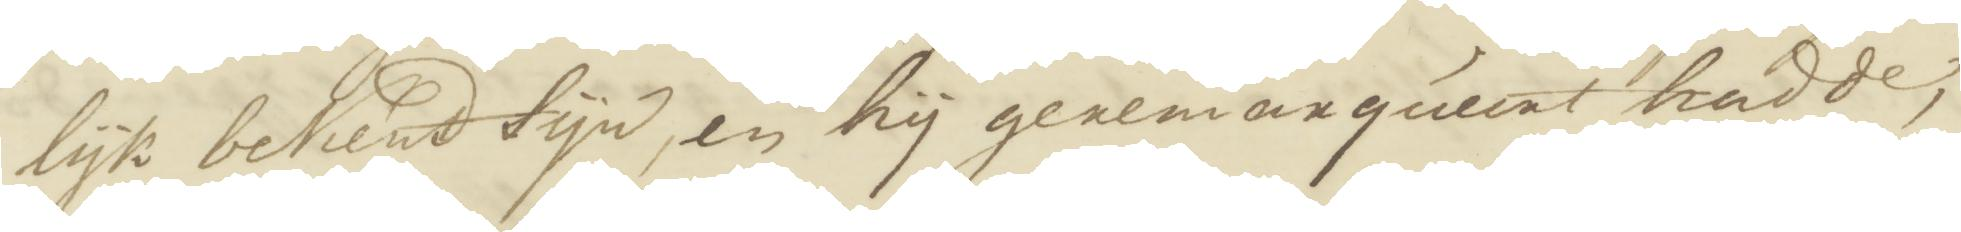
lijk bekend sijn, en hij geremarqueert hadde,
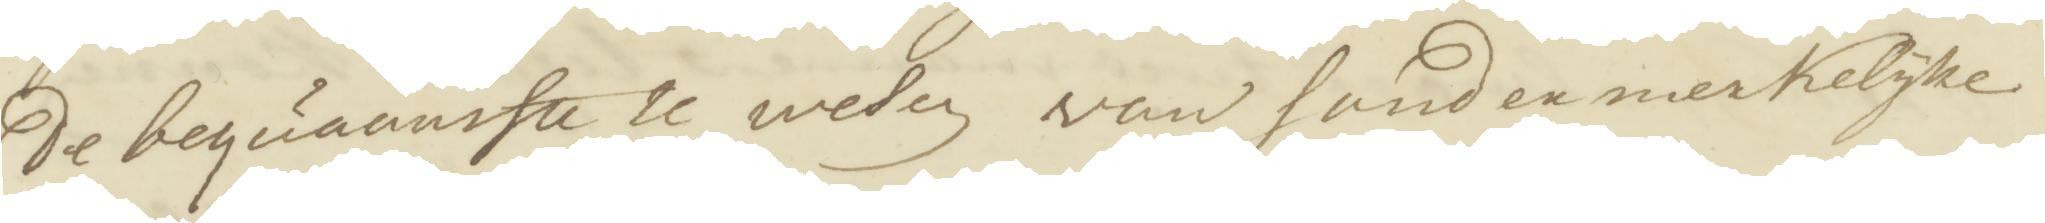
de bequaamste te wesen van souder merkelijke
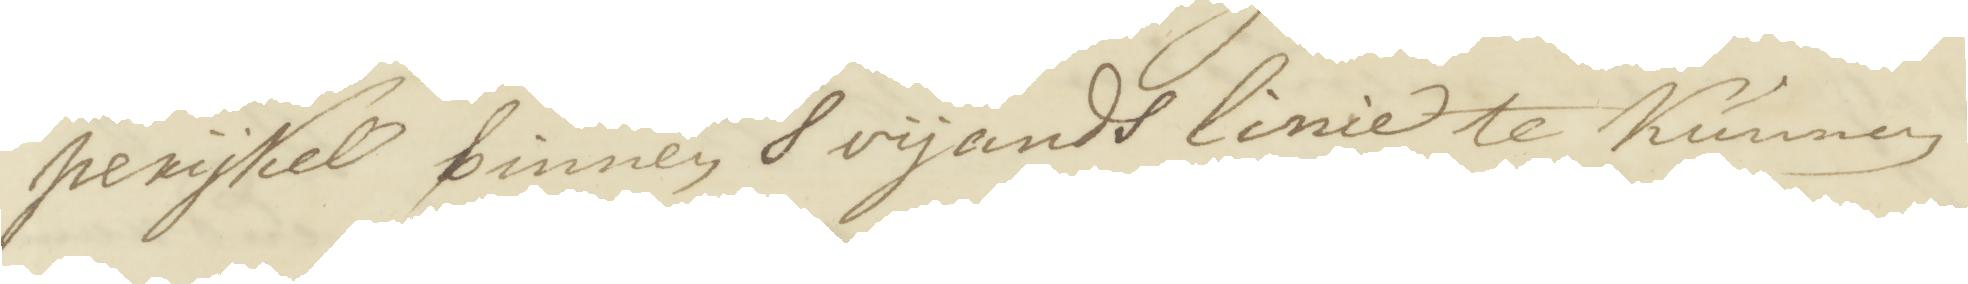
perijkel binnen 's vijands linie te kunnen
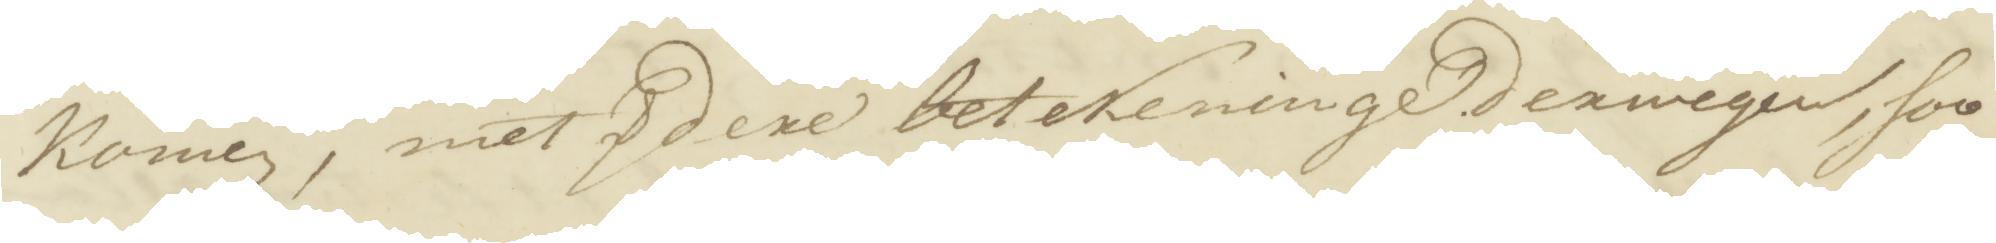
komen, niet verdere betekeninge derwegen, soo
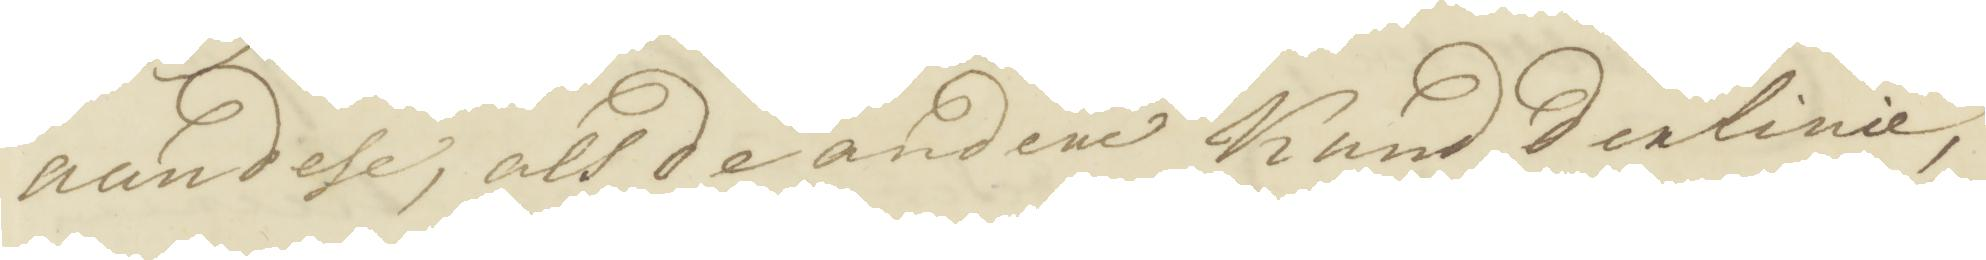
aan dese, als de andere kand der linie,
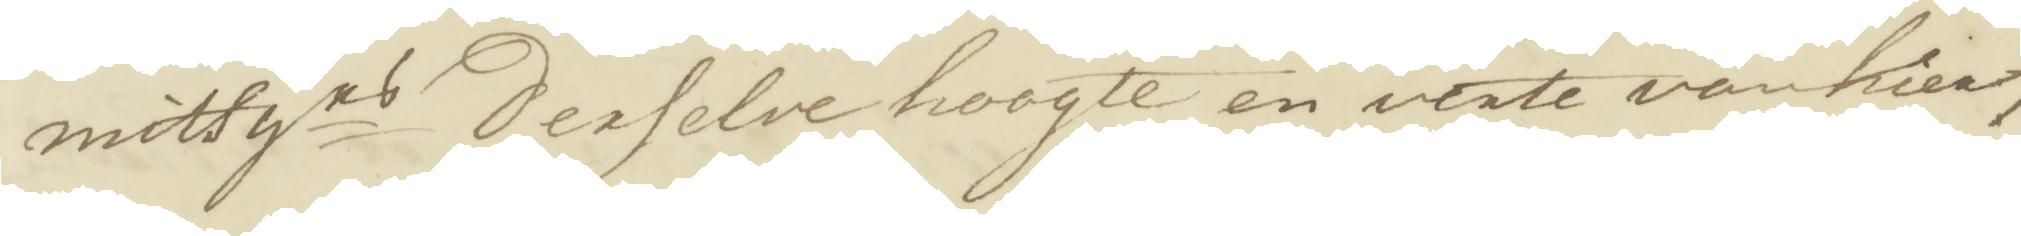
mitsg=rs derselve hoogte en verte van hier,
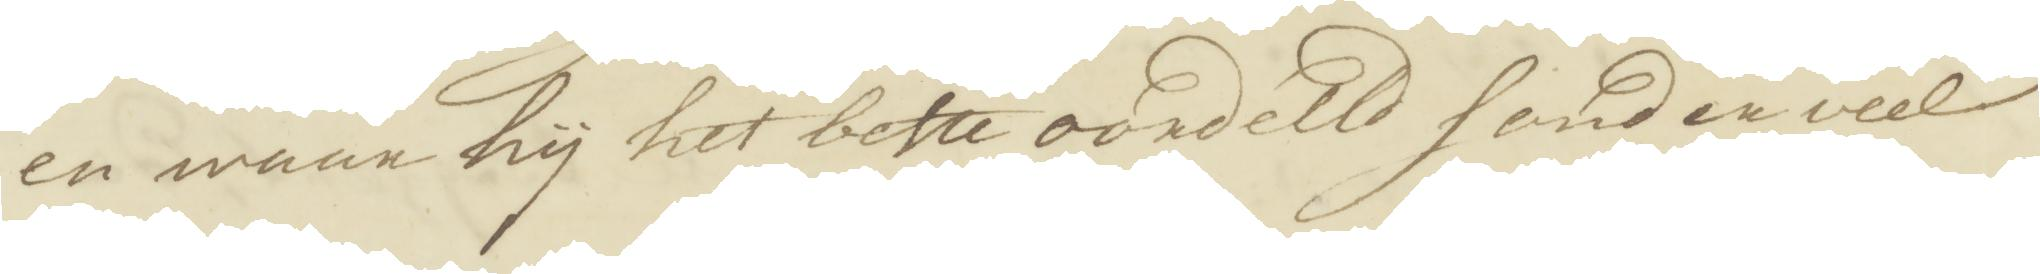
en waar hij het beste oordeeld soud er veel
